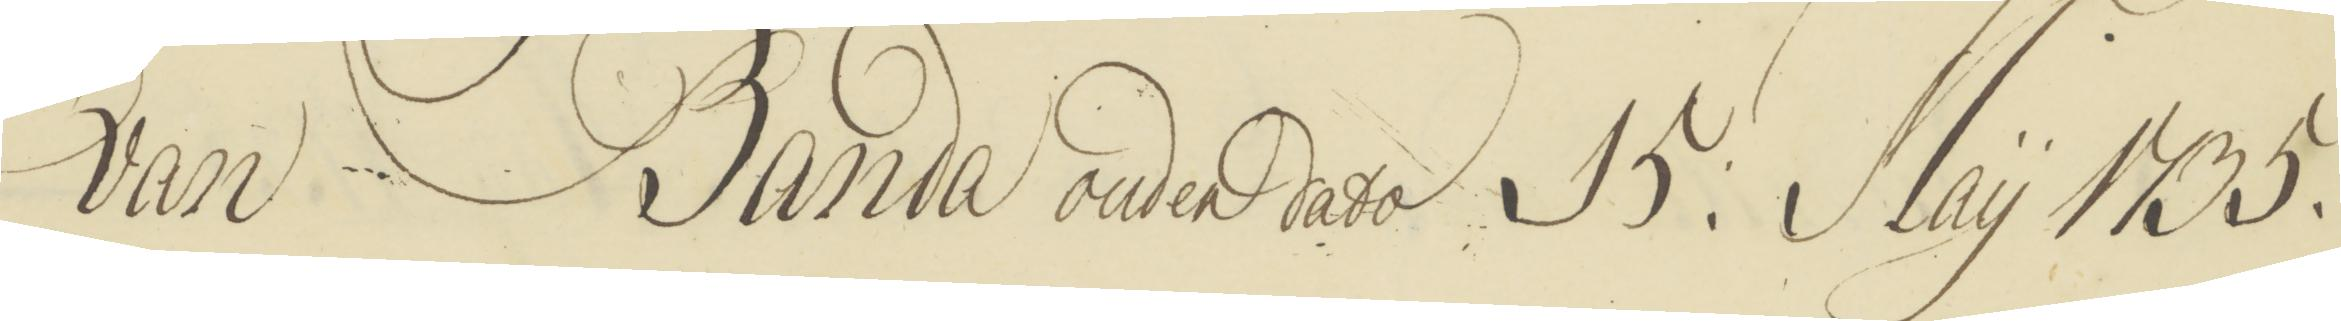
Van Banda onder dato 15:' Maij 1735.
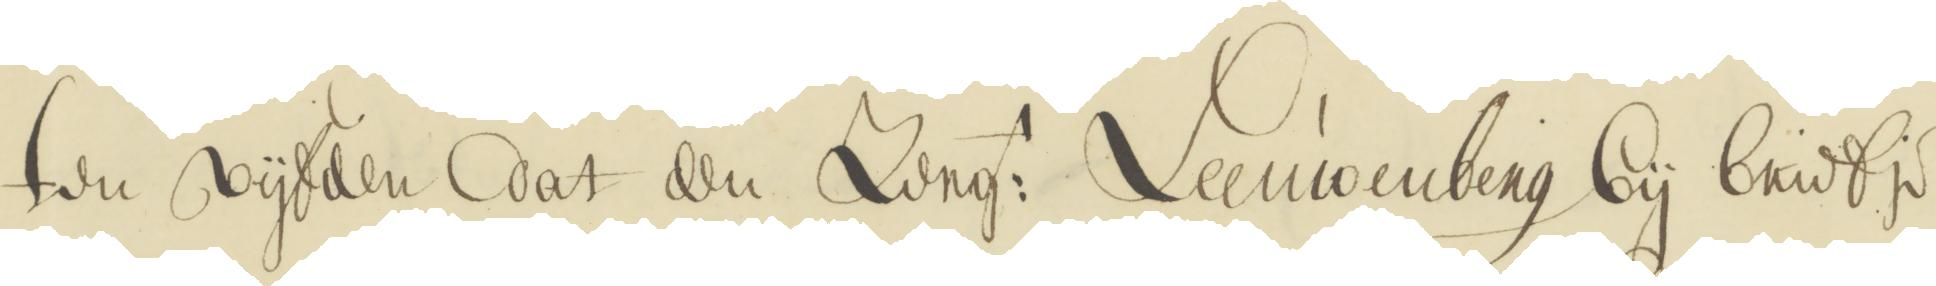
ten vijfden dat den Zerg:t Leeuwenberg bij briefje
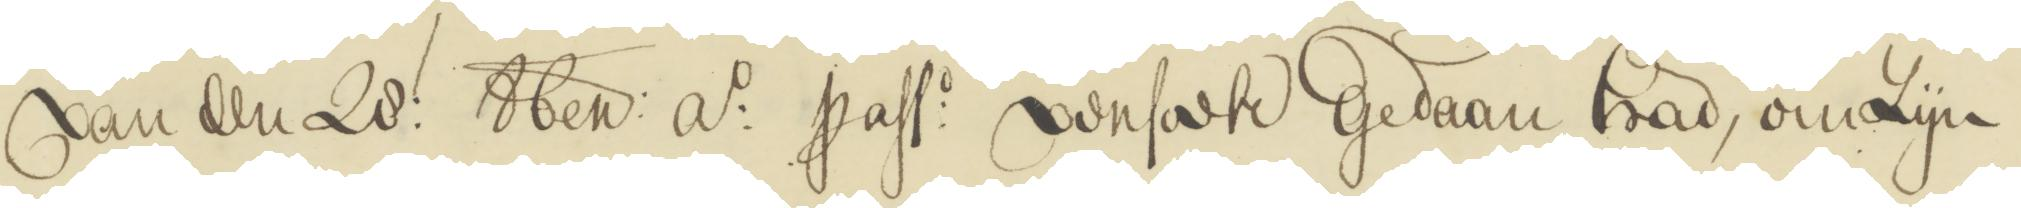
van den 28.' 8ber: a:o pass:o versoek gedaan had, om Zijn
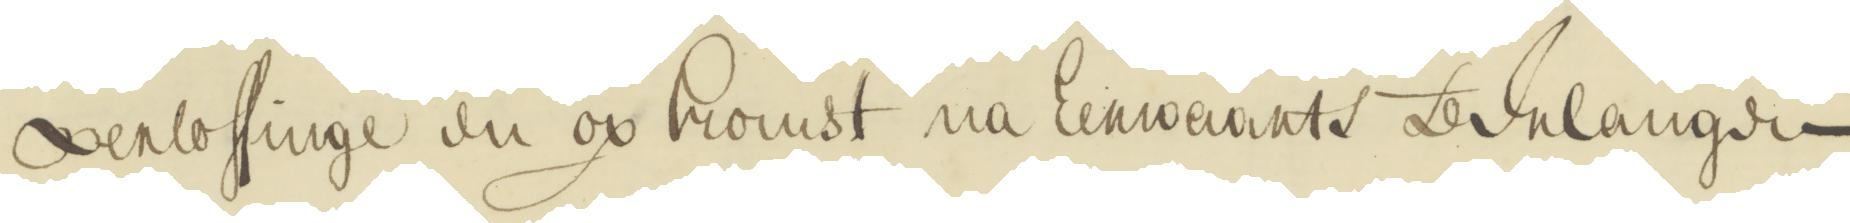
verlossinge en op komst na herwaarts te Erlangen
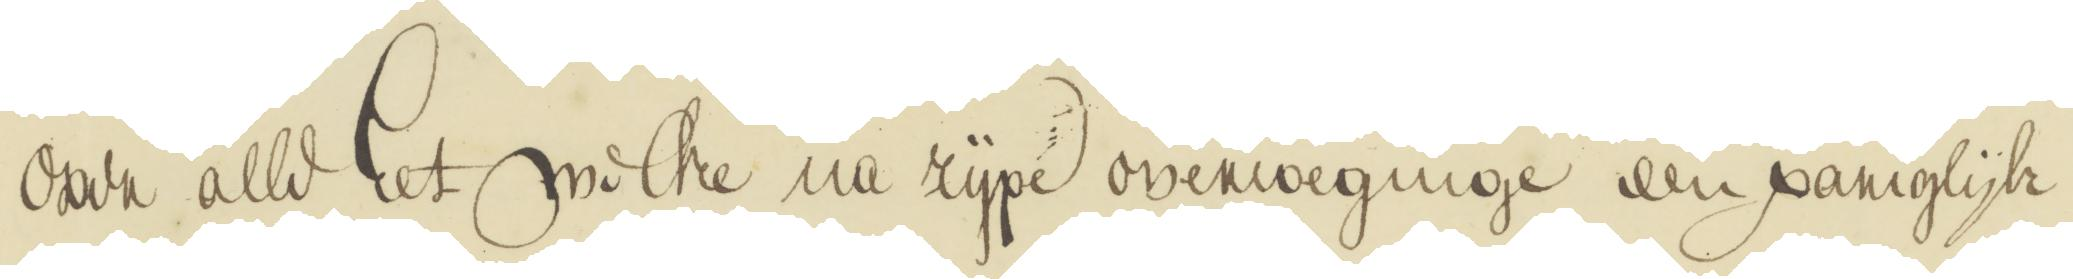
over alle het welke na rijpe overweginge eenpariglijk
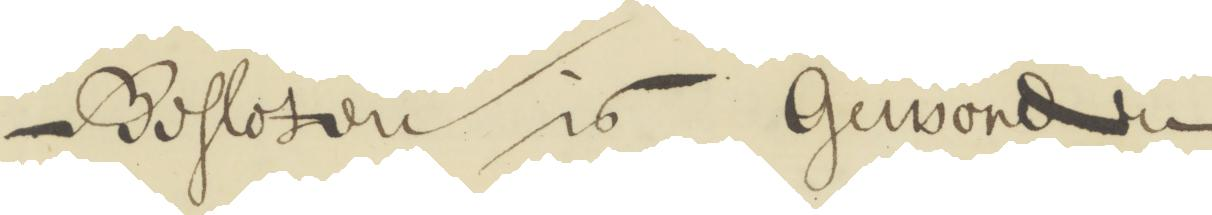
Besloten is geworden
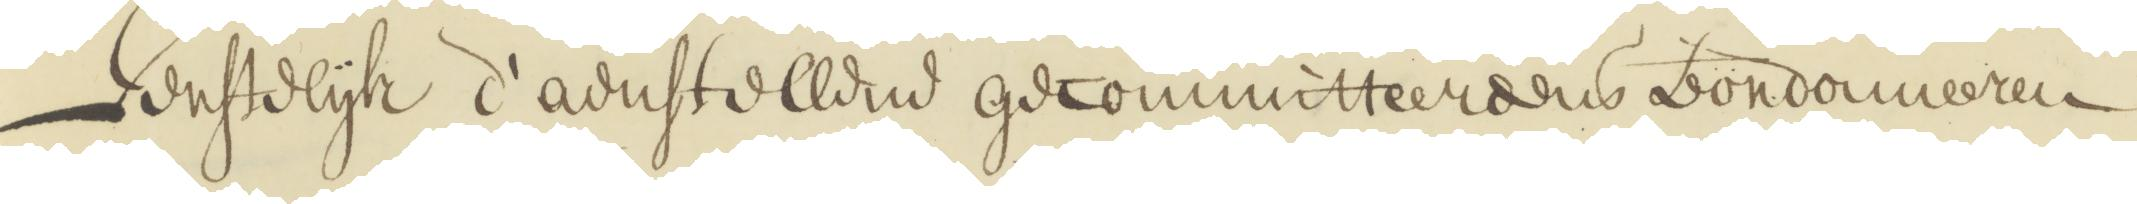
Eerstelijk d’ aenstellene gecommitteerdens te ordonneeren
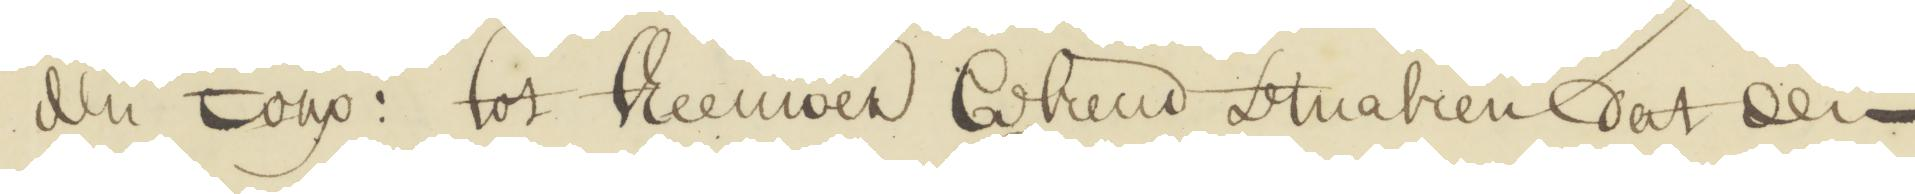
den Corp:l tot theeuwer bekend te maken dat den
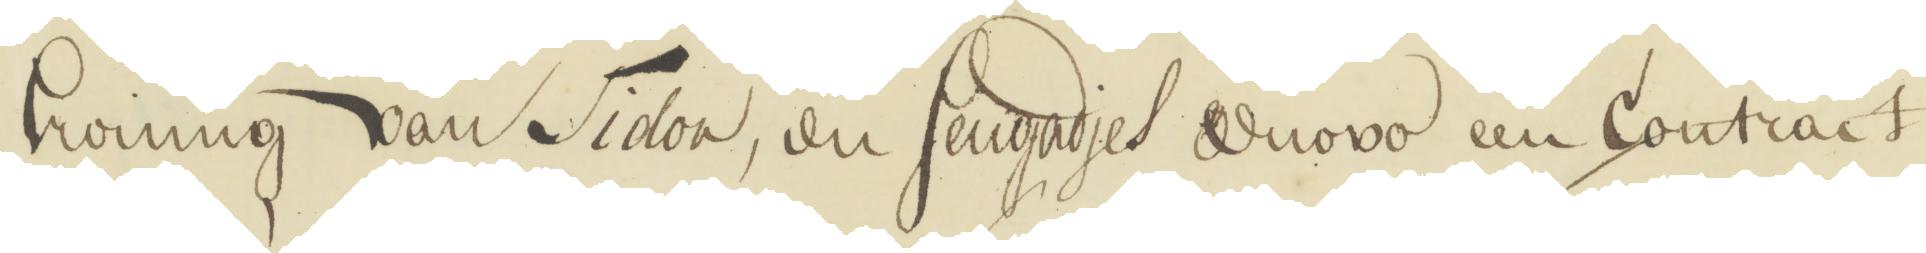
koning van Tidor, en Sengadjes denovo een Contract
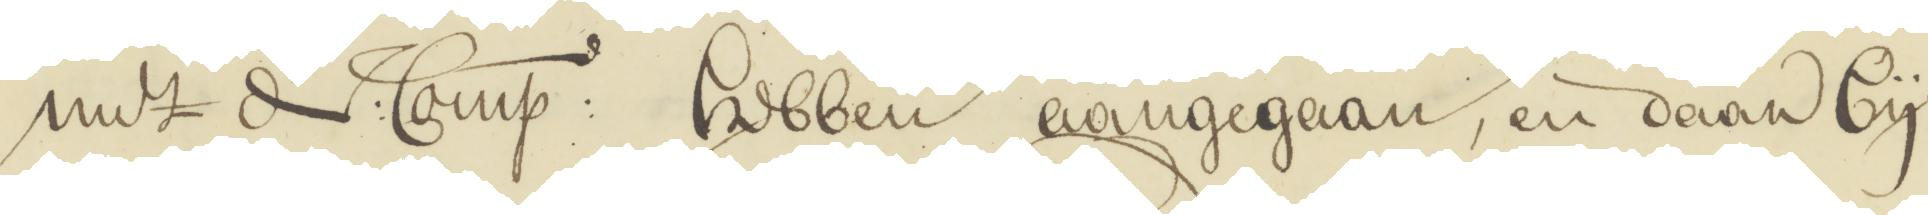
met d' E:Comp:e hebben aangegaan, en daar bij
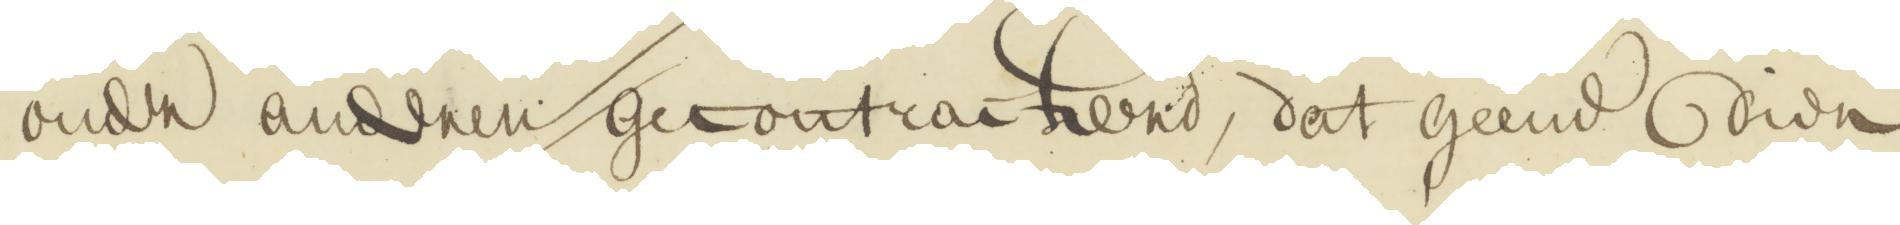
onder anderen gecontracteerd, dat geene dier
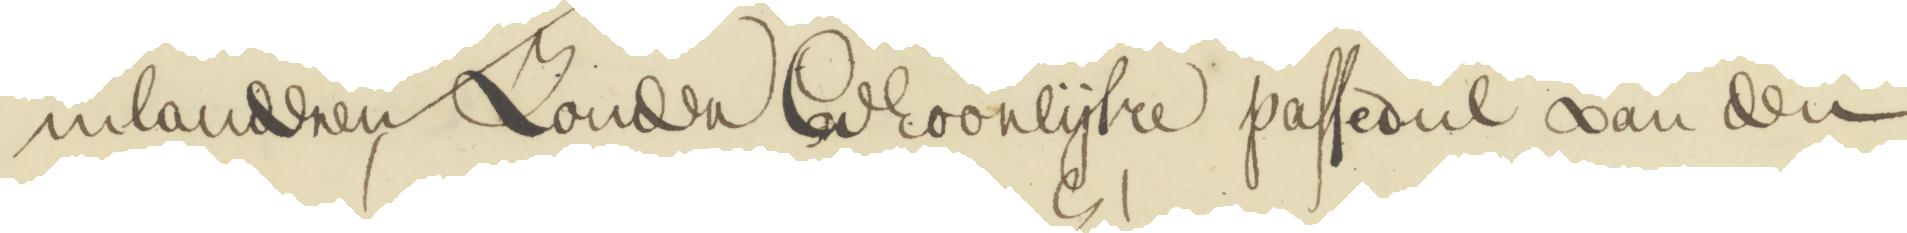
inlanderen Zonder behoorlijke passedul van den
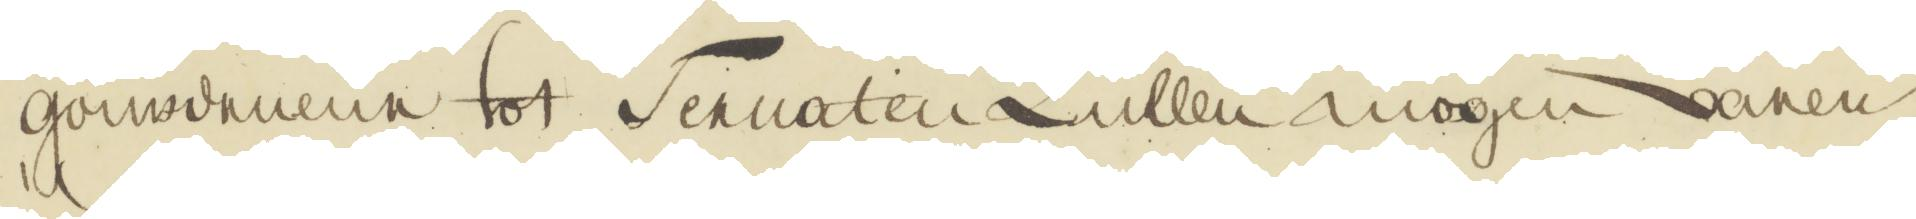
gouverneur tot Ternaten Zullen mogen varen,
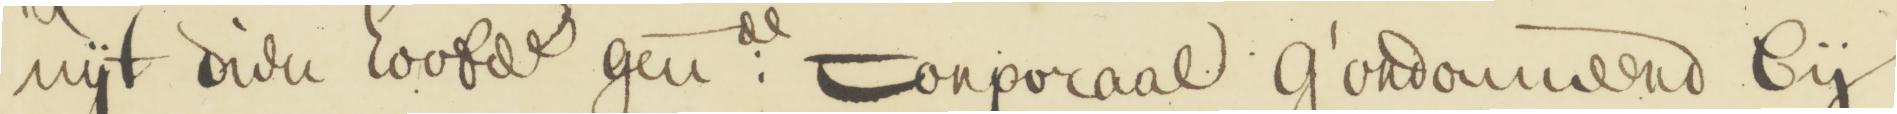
uijt dien hoofde gen:de Corperaal g’ordonneerd bij
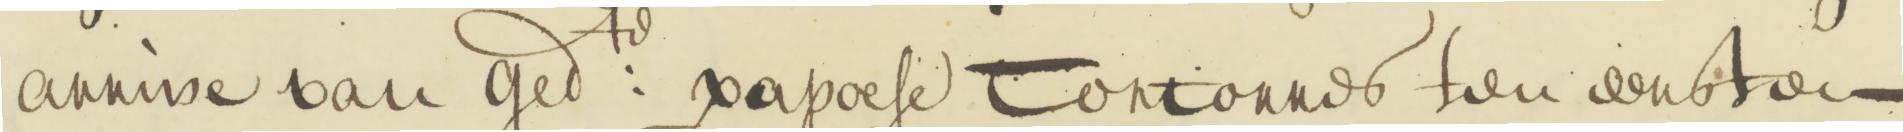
arrive van ged:te papoese Corcorres ten eersten
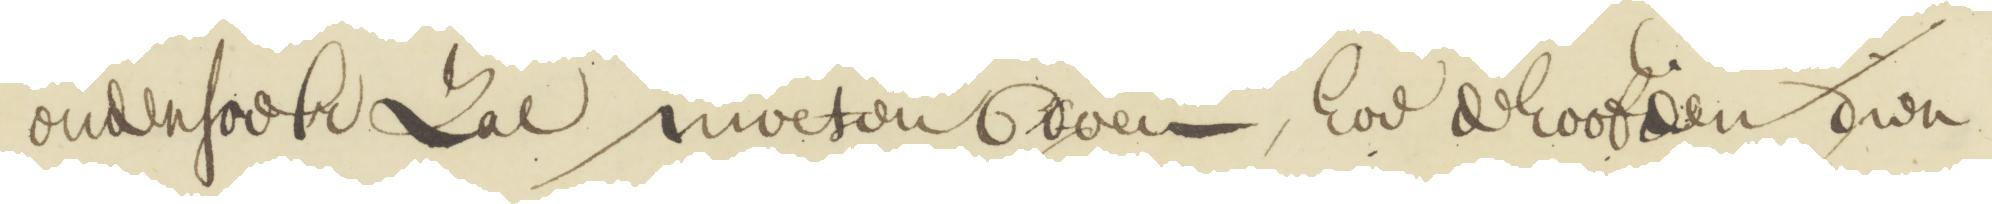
ondersoek Zal moeten doen, hoe de hoofden dier
